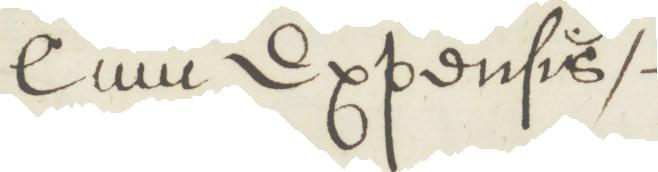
cum Expensis/
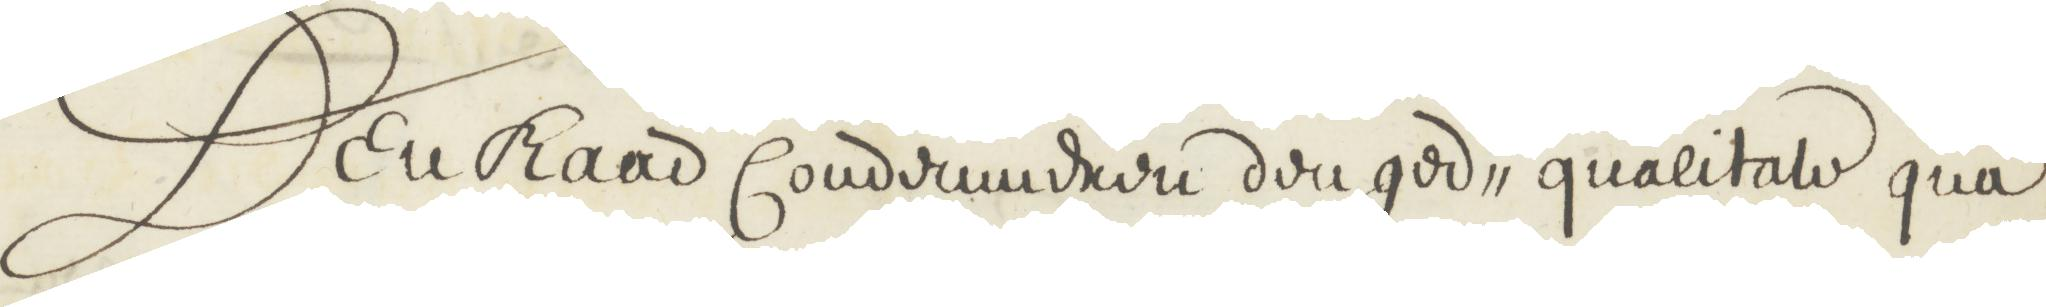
Den Raad Condemneren den ged„e qualitate qua
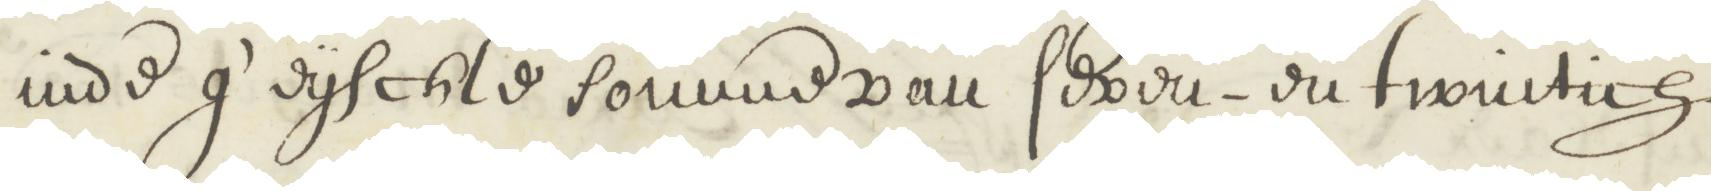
inde g’eijschte somme van seven - en twintich
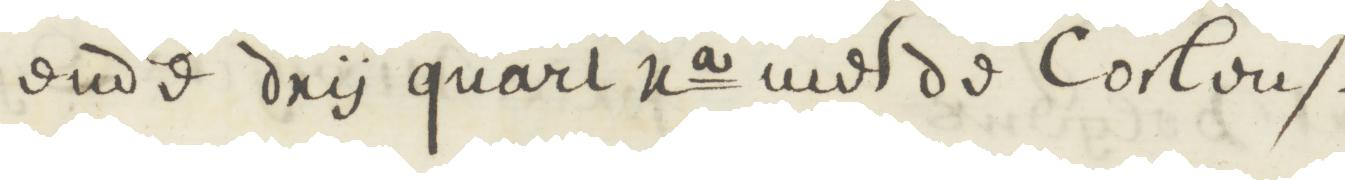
ende drij quart r=a met de Costen/
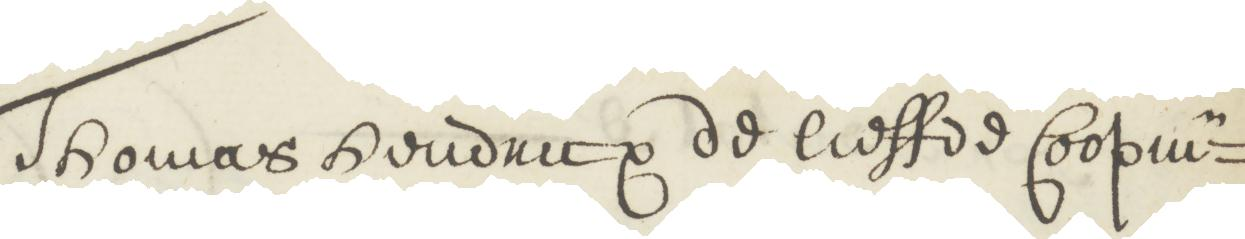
Thomas Hendricx de lieffde Coopm=n
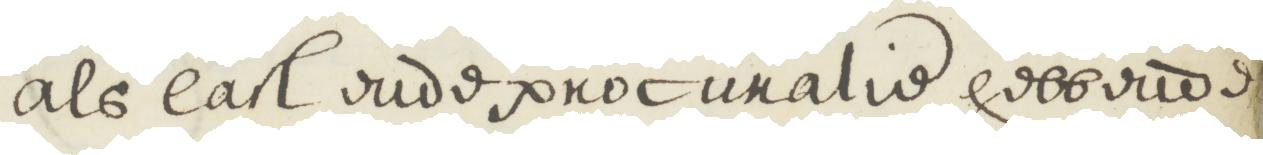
als carl ende procuratie hebbende
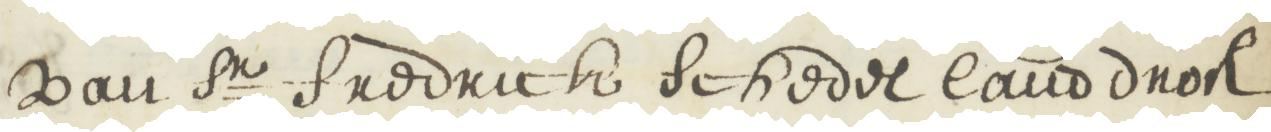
van s=r Fredrick schedel land drost
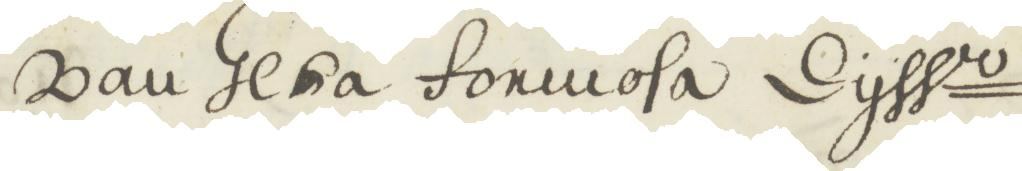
van Ilha formosa Eijss=r
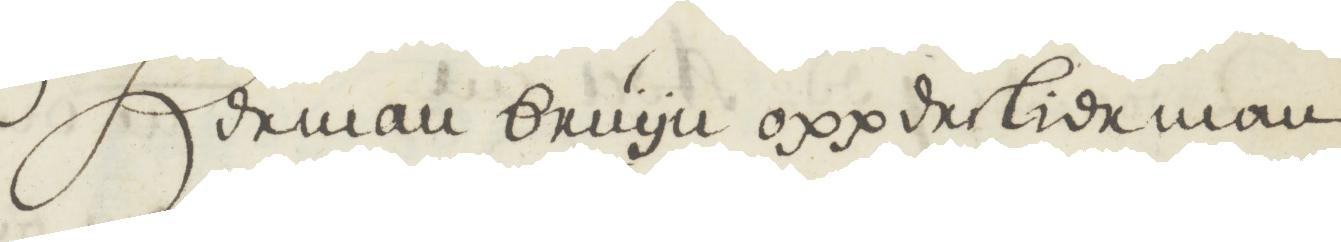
Herman bruijn opperstierman
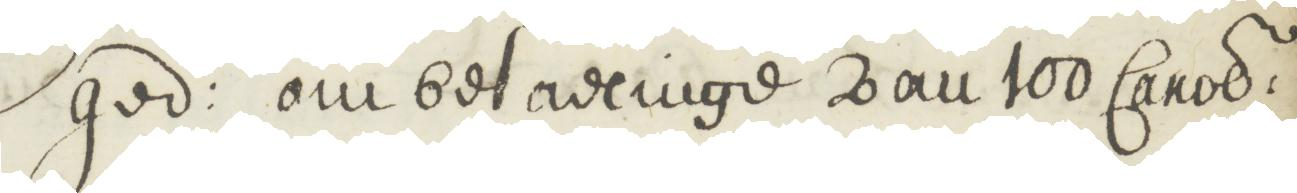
ged:e om betaelinge van 100 Carol:e
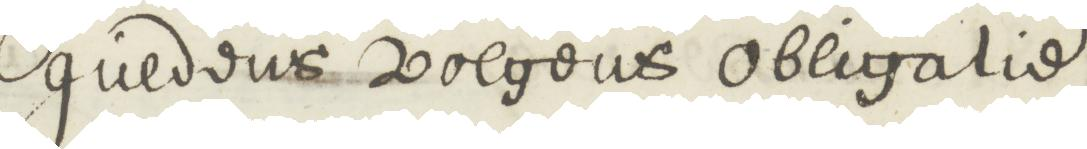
guldens volgens obligatie
